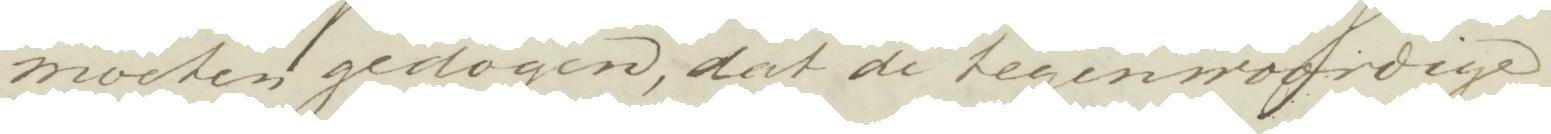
moeten gedogen, dat de tegenwoordige
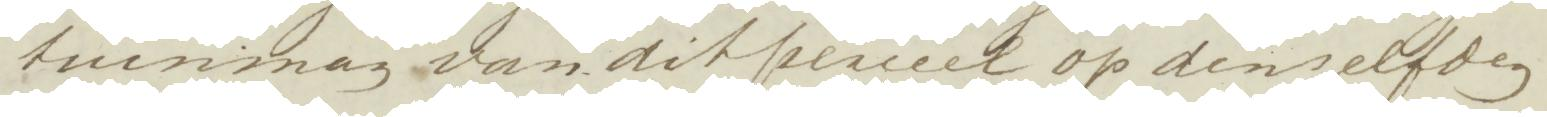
tuinman van dit perceel op den zelfden
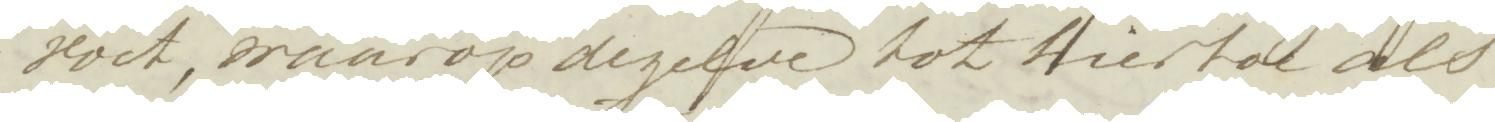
voet, waarop dezelve tot hiertoe als
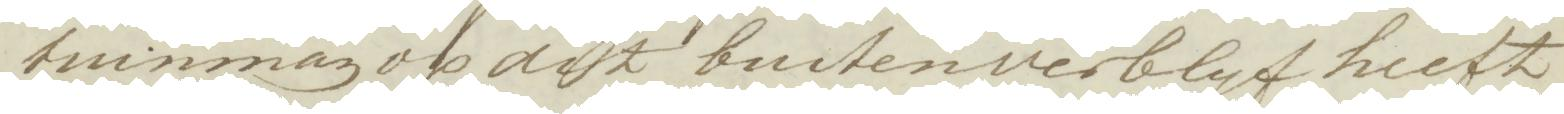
tuinman op dit buitenverblyf heeft
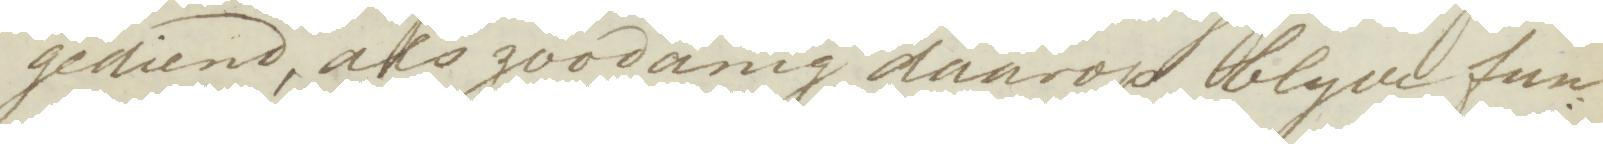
gediend, als zoodanig daar op blyve fun„
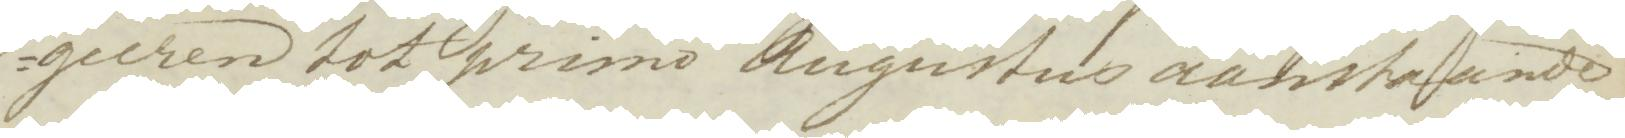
„geeren tot primo Augustus aanstaande
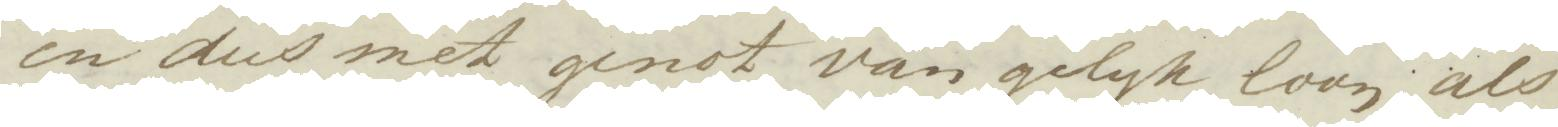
en dus met genot van gelyk loon, als
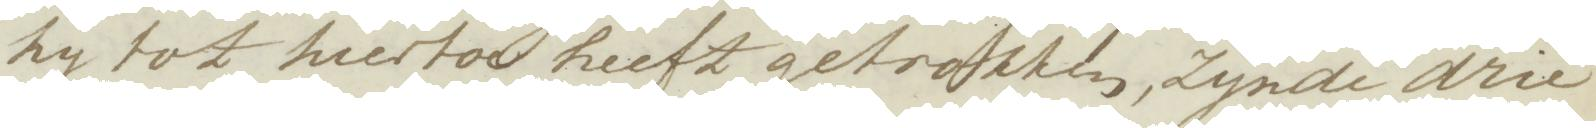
hy tot hier toe heeft getrokken, zijnde drie
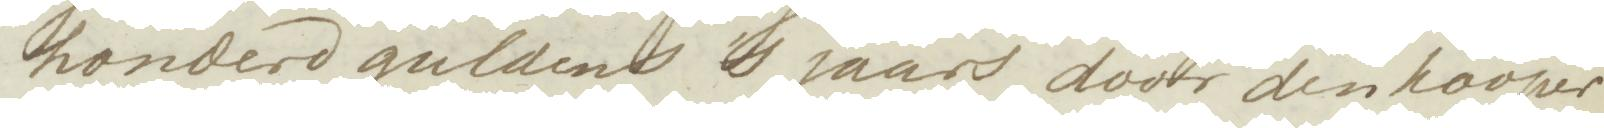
honderd guldens ’s jaars, door den kooper
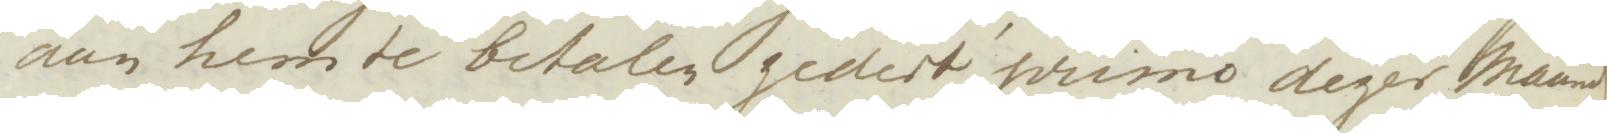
aan hem te betalen zedert primo dezer Maand
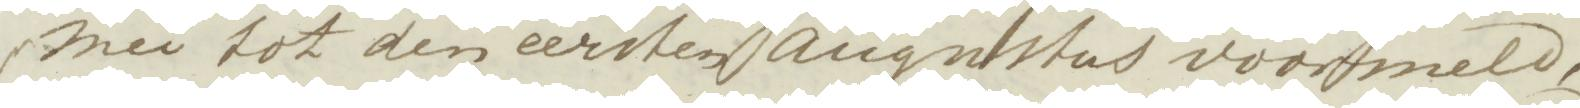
Mei tot den eersten Augustus voormeld,
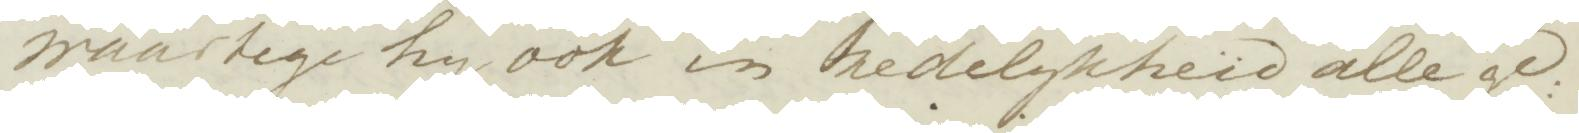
waartege hy ook in redelykheid alle ge„
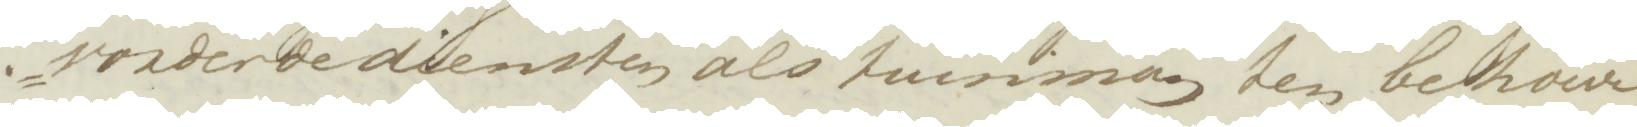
„vorderde diensten als tuinman ten behoeve
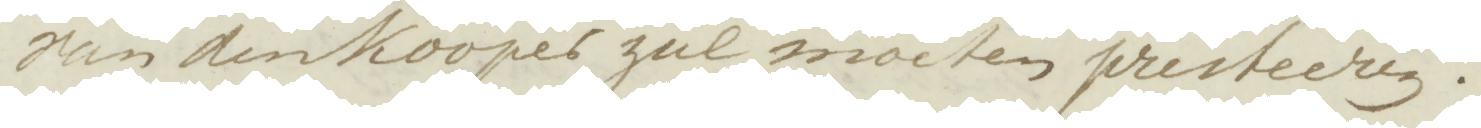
van den kooper zul moeten presteeren.
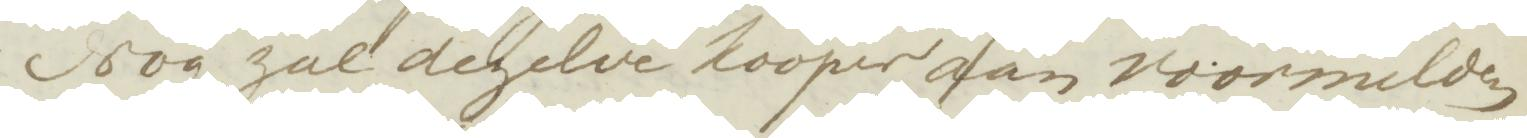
Nog zal dezelve kooper aan voormelden
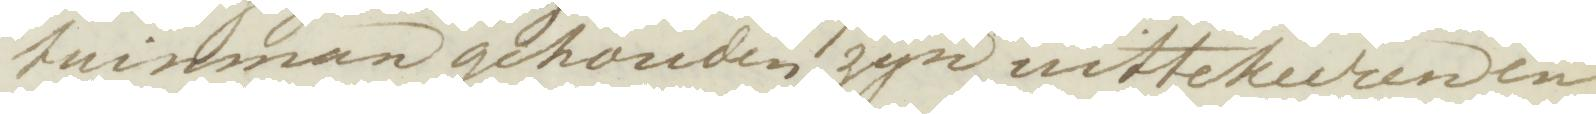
tuinman gehouden zijn uittekeeren en
